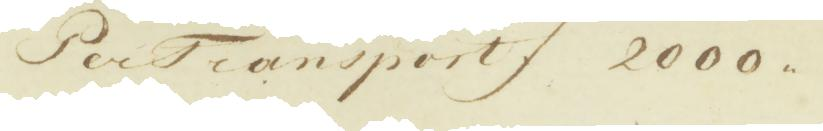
Per Transport ƒ 2000 „
